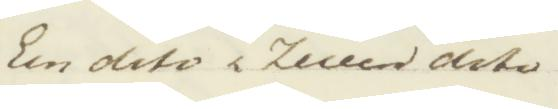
Een dito & zeven dito
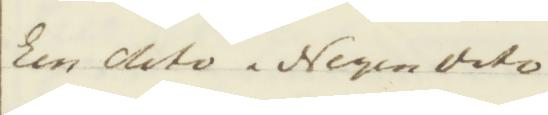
Een dito & Negen dito
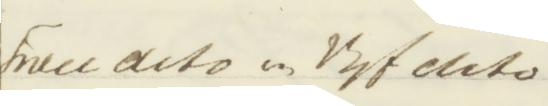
Twee dito en Vyf dito
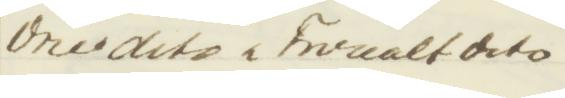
drie dito & Twaalf dito
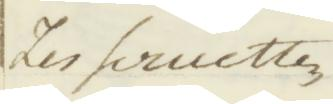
Zes servetten
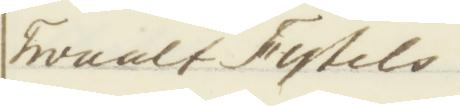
Twaalf Fytels
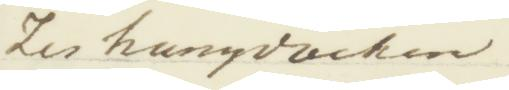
Zes hanydoeken
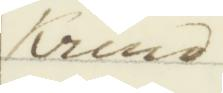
Krend
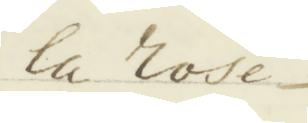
la rose
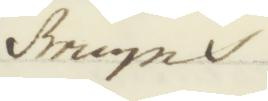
Bruyns
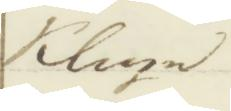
Kleyn
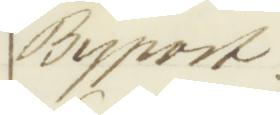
Byport
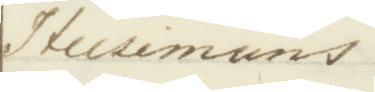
Huzimans
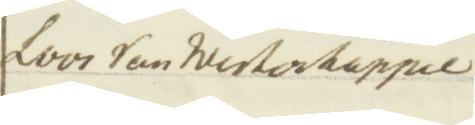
Loos Van Westerkappel
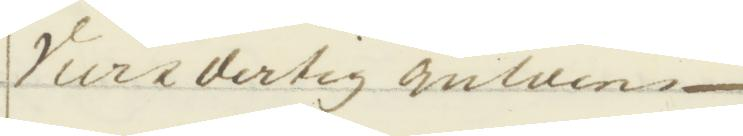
Vier & dertig guldens
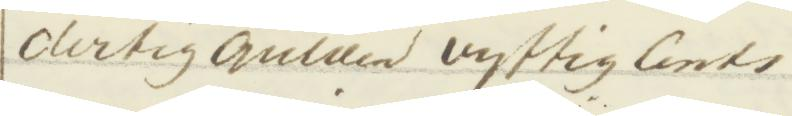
dertig gulden vyftig Cents
